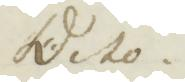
Dito. . . . . . . . . .
